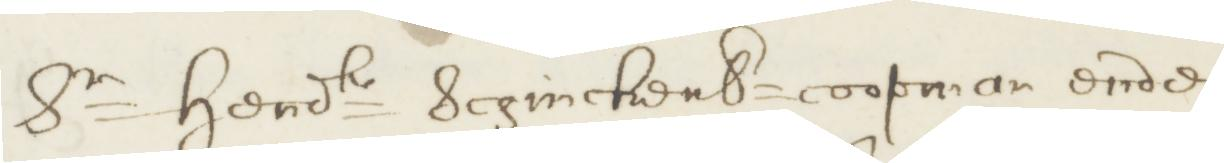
S=r hend=k schinckenb=s coopman ende
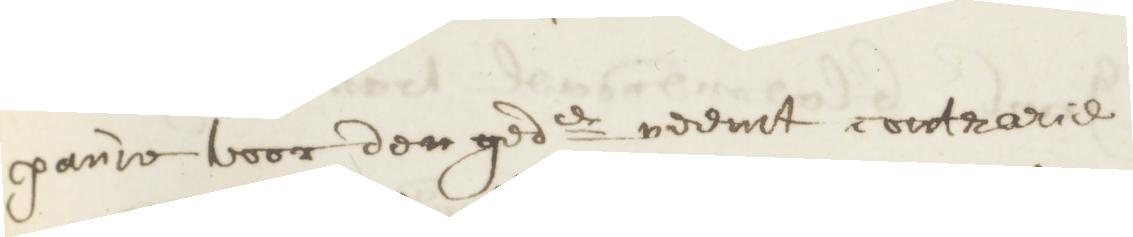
pauw voor den ged=e neemt contrarie
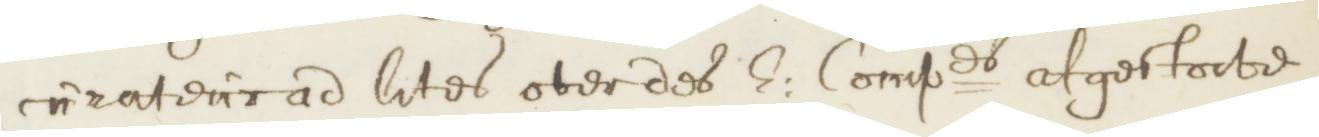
curateurad lites over des E: Comp=es afgestorte
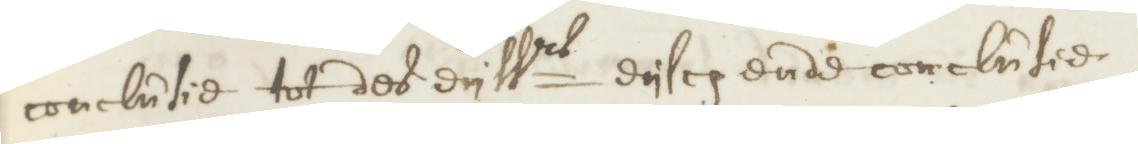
conclusie tot des eijss=rs eijsch ende conclusie
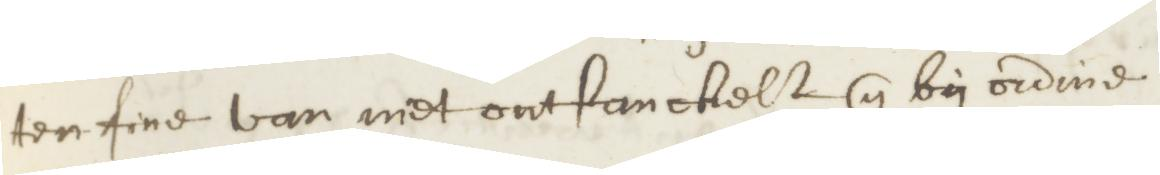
ten fine van nietontfanckelijk ende bij ordine
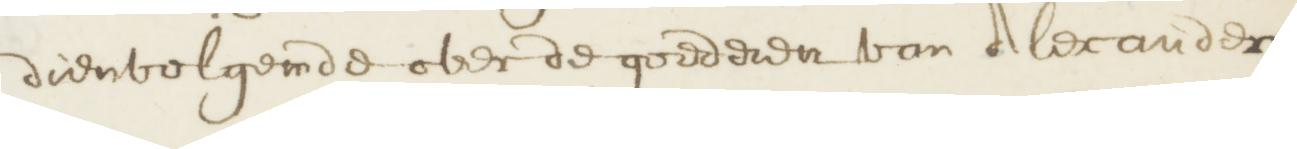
dienvolgende overdegoederen van Alexander
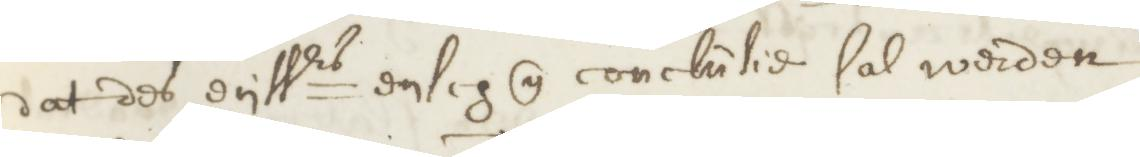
dat des eijss=rs eysch ende conclusie sal werden
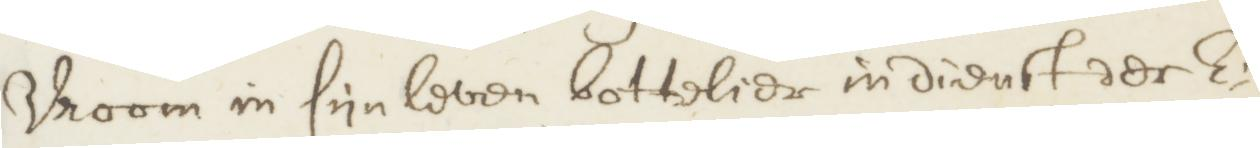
Vroom in sijn leven bottelier in dienst der E:
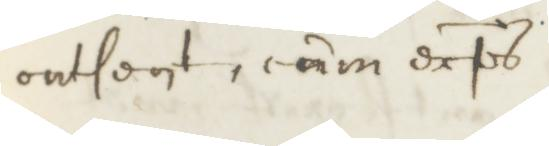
ontseyt, cum exps
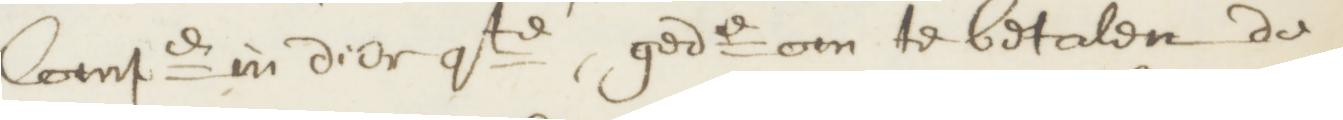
Comp=e in dier q=t ged=e om te betalen de
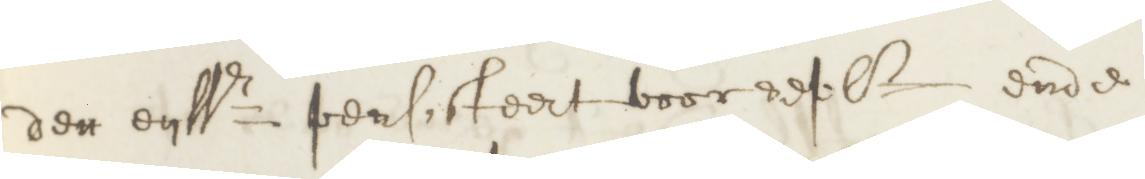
den eyss=r persisteert voor replijk ende
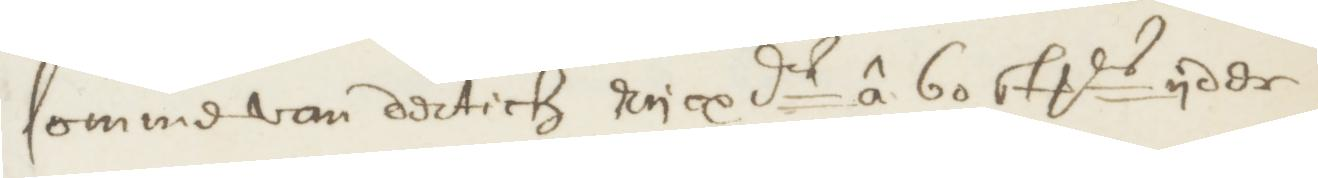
somme van dertich rijcx d=rs â. 60 stver=rs ijder
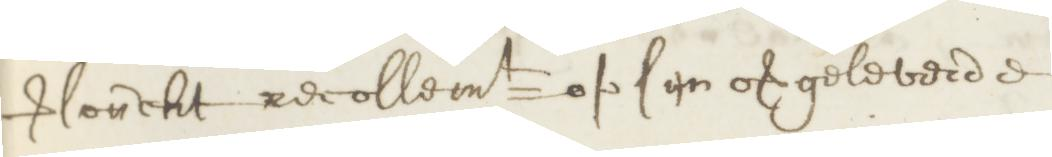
versouckt recollem=t op sijn overgeleverde
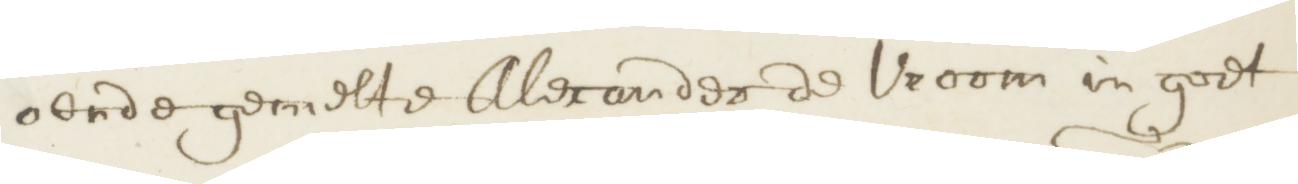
aende gemelte Allexander de Vroom in goet
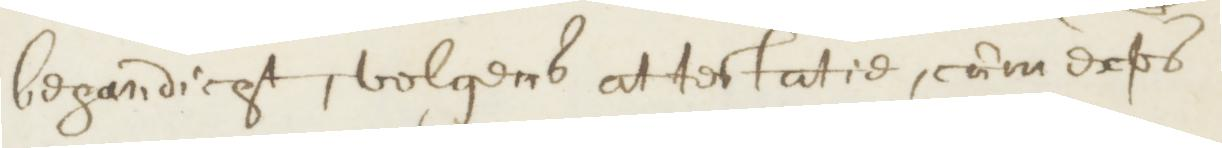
behandicht, volgens attestatie, cum exps
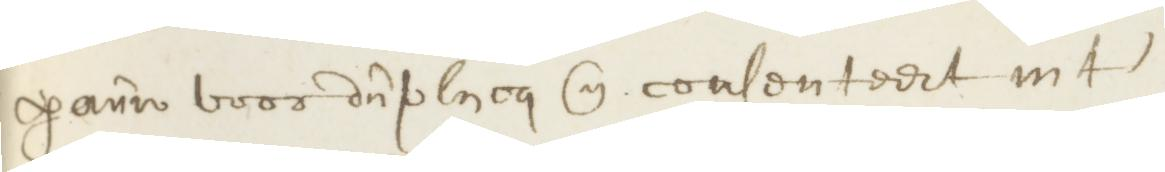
pauw voor duplycq ende consenteert in t'
